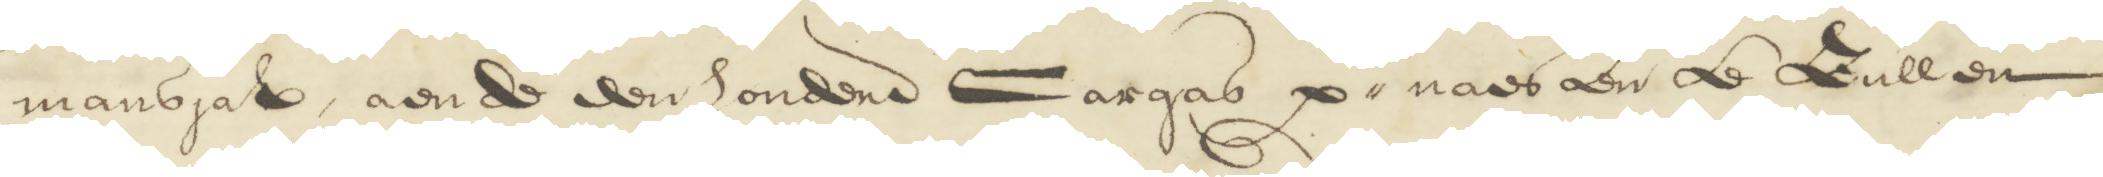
mansjab, aen de een honderd Cargas p„r naesten te Zullen
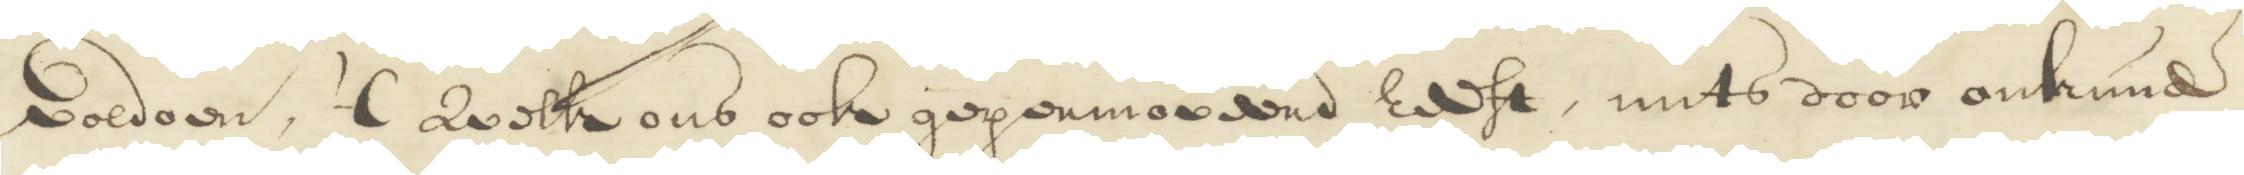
voldoen, ’t welk ons ook gepermoveerd heeft, mits door onkunde
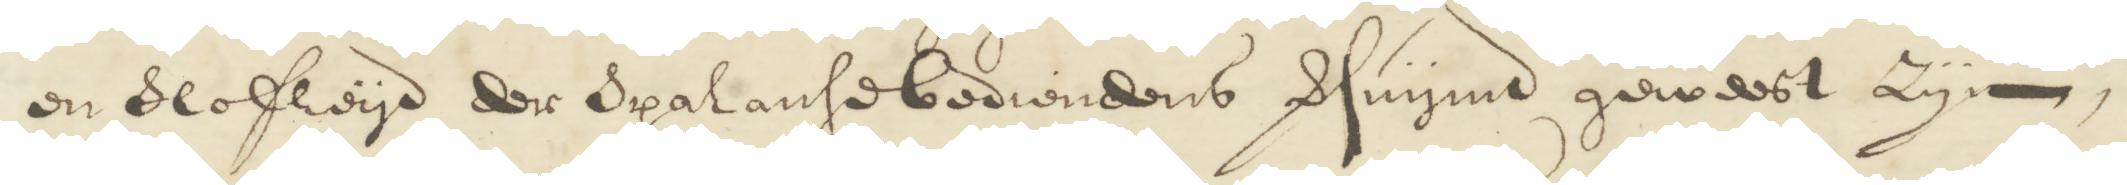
en slofheijd der Spahanse bediendens versuijmd geweest Zijn,
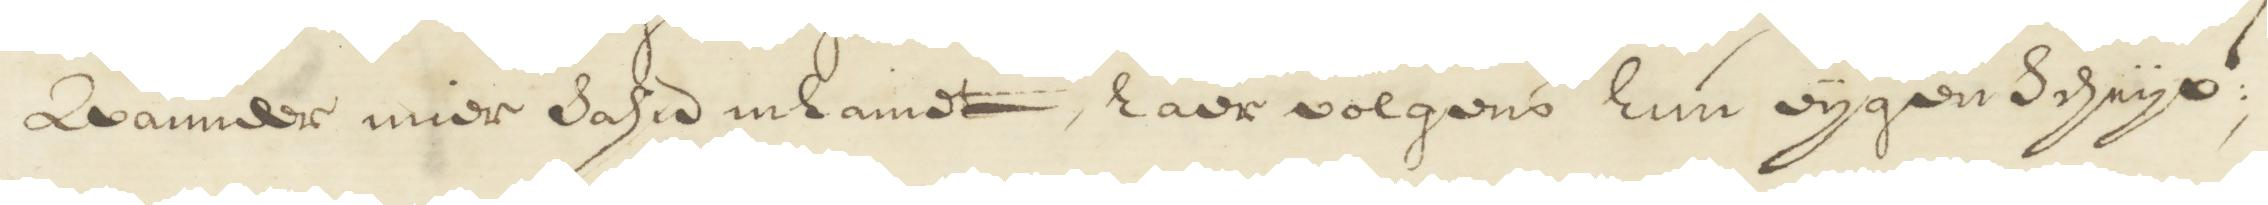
wanneer mier sahid inhamet, haer volgens hun eijgen Schrijv:,
